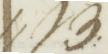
13:
